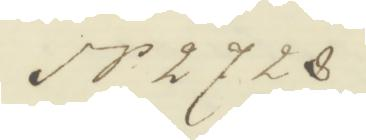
N 2728
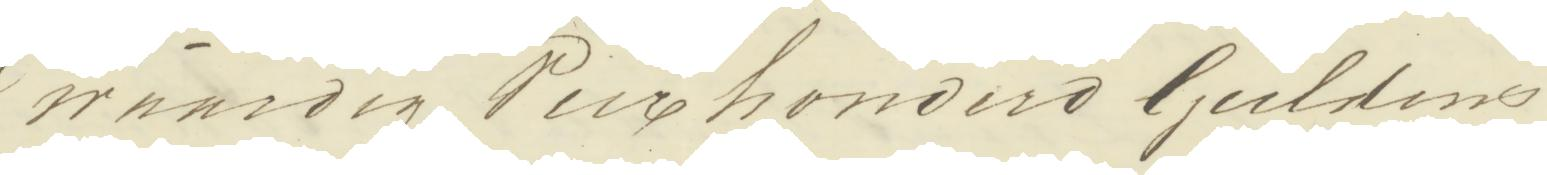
waardig Vier honderd Guldens
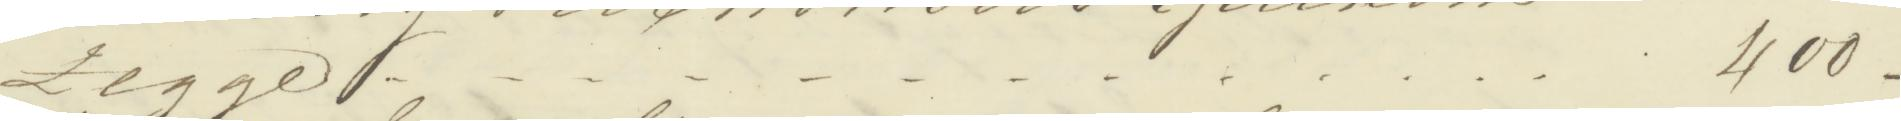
zegge - - - - - - - . . . . . 400
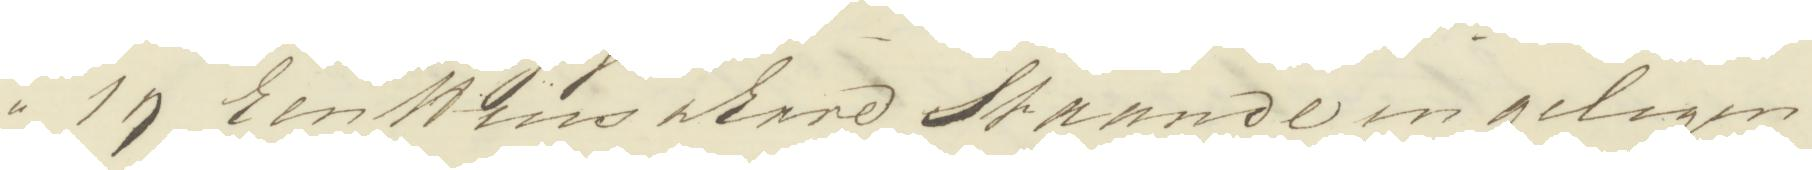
„ 19 Een Huis en Erve staande en gelegen
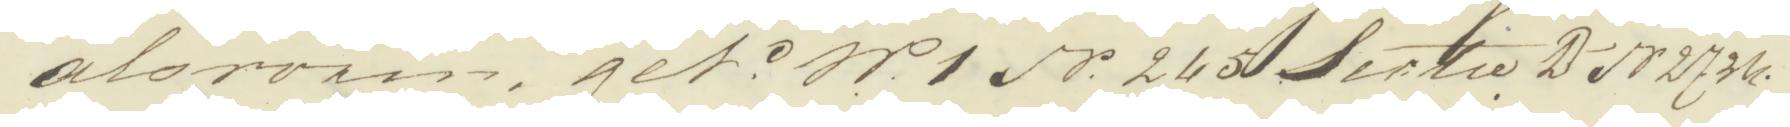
als voren, get.d W.1 N.o 245 Sectie D No 2736.
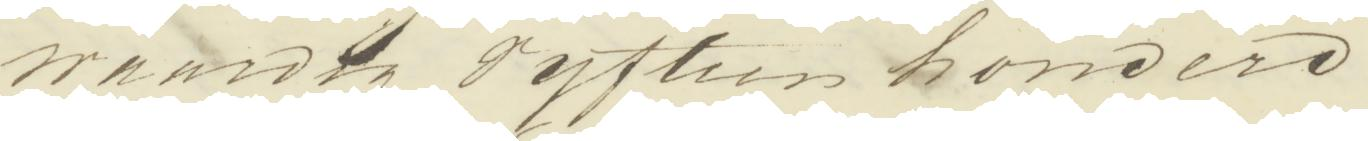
waardig Vyftien honderd
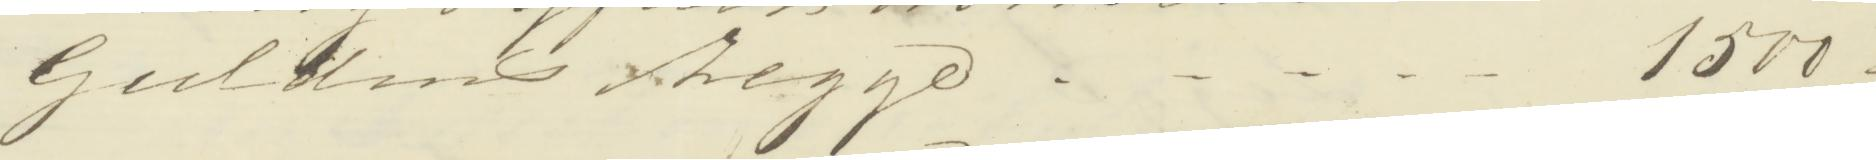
Guldens Zegge . - - - - 1500
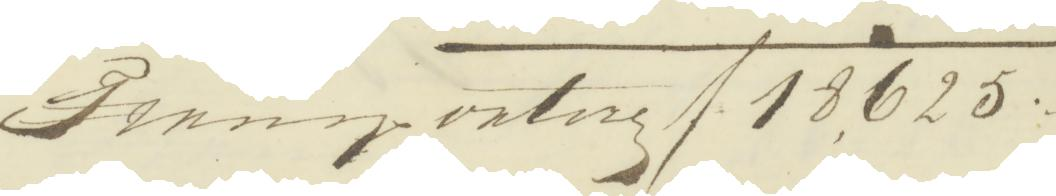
Transporteren ƒ 18,625.
